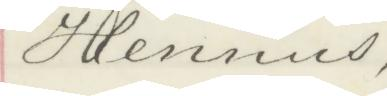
Hennus
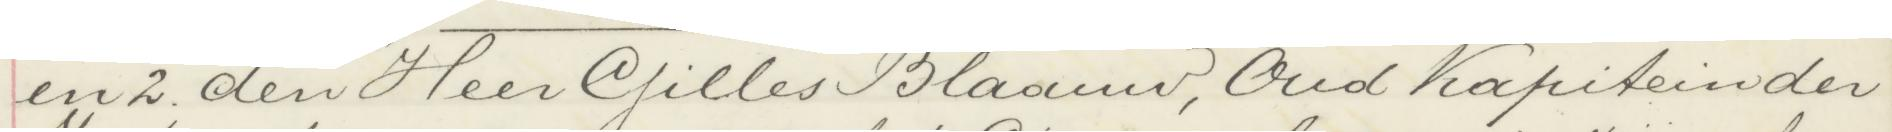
en 2. den Heer Gilles Blaauw, Oud Kapitein der
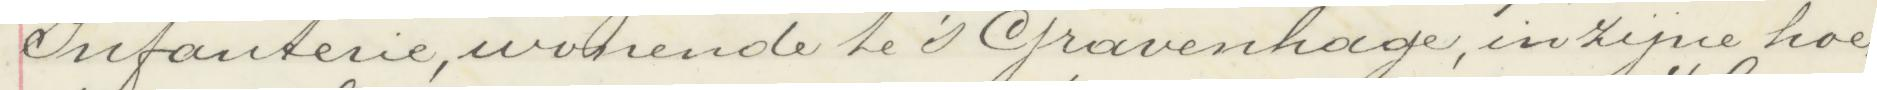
Infanterie, wonende te 's Gravenhage, in zijne hoe
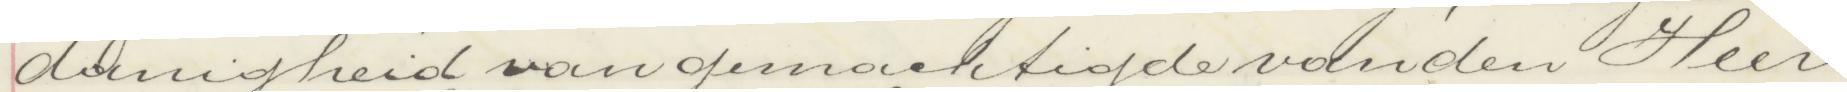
danigheid van gemachtigde van den Heer
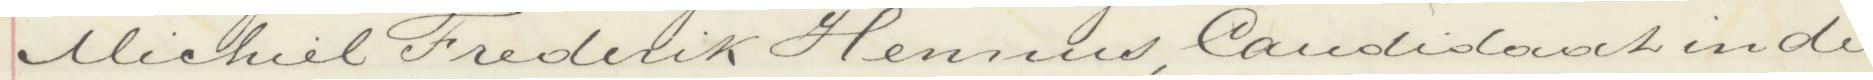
Michiel Frederik Hennus, Candidaat in de
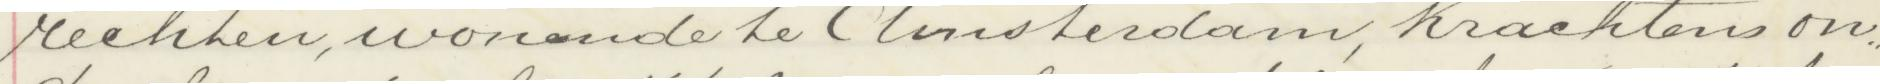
rechten, wonende te Amsterdam, krachtens on
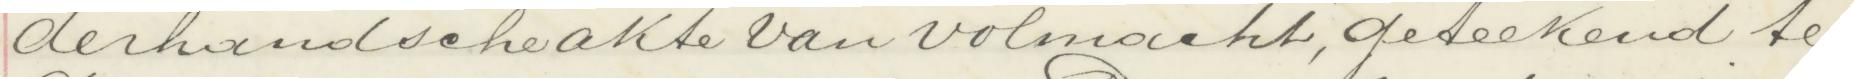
derhandsche akte van volmacht, geteekend te
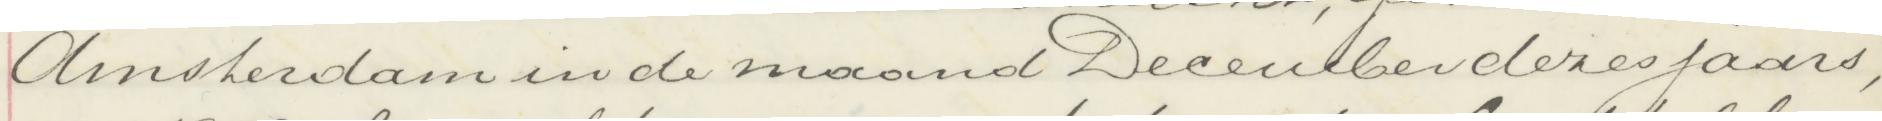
Amsterdam in de maand December dezes jaars
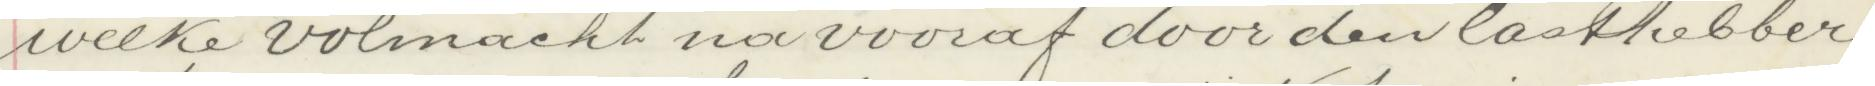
welke volmacht na vooraf door den lasthebber
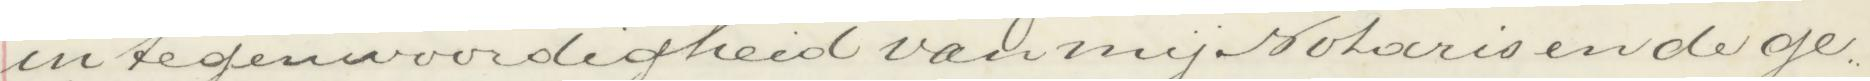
in tegenwoordigheid van mij Notaris en de ge„
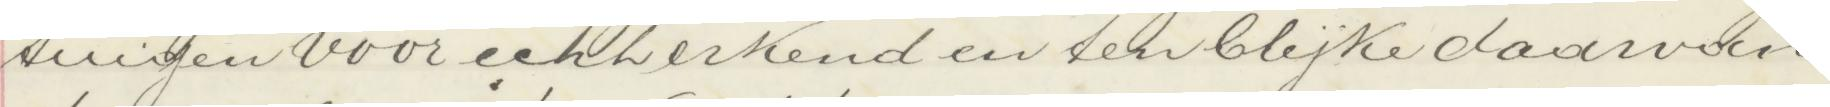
tuigen voor echt erkend en ten blijke daarvan
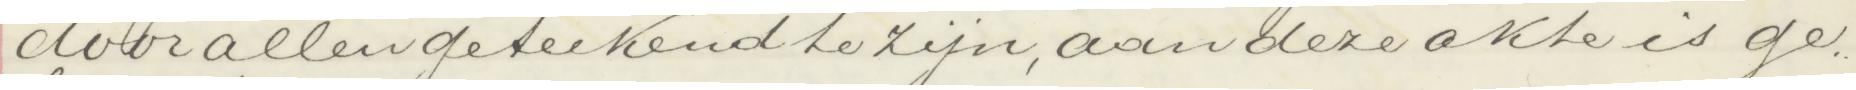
door allen geteekend te zijn, aan deze akte is ge„
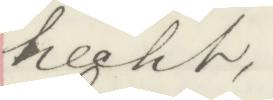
hecht,
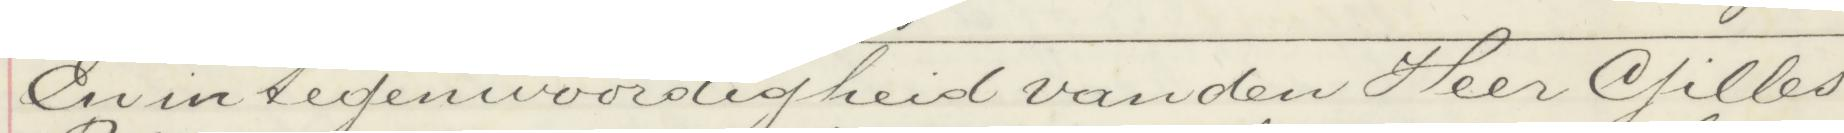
En in tegenwoordigheid van den Heer Gilles
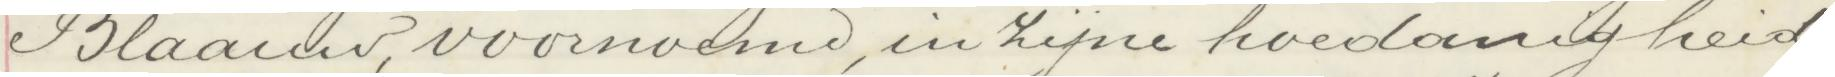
Blaauw, voornoemd, in zijne hoedanigheid
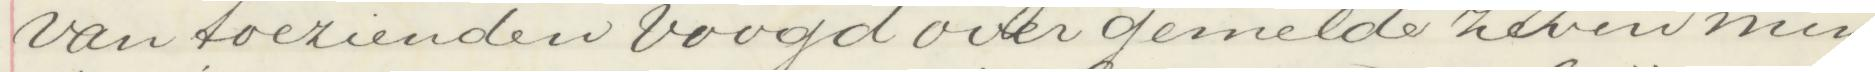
van toezienden voogd over gemelde zeven min
